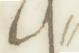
4„
